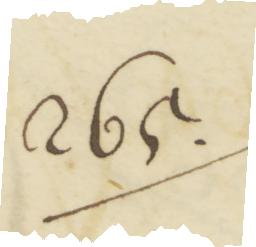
265.
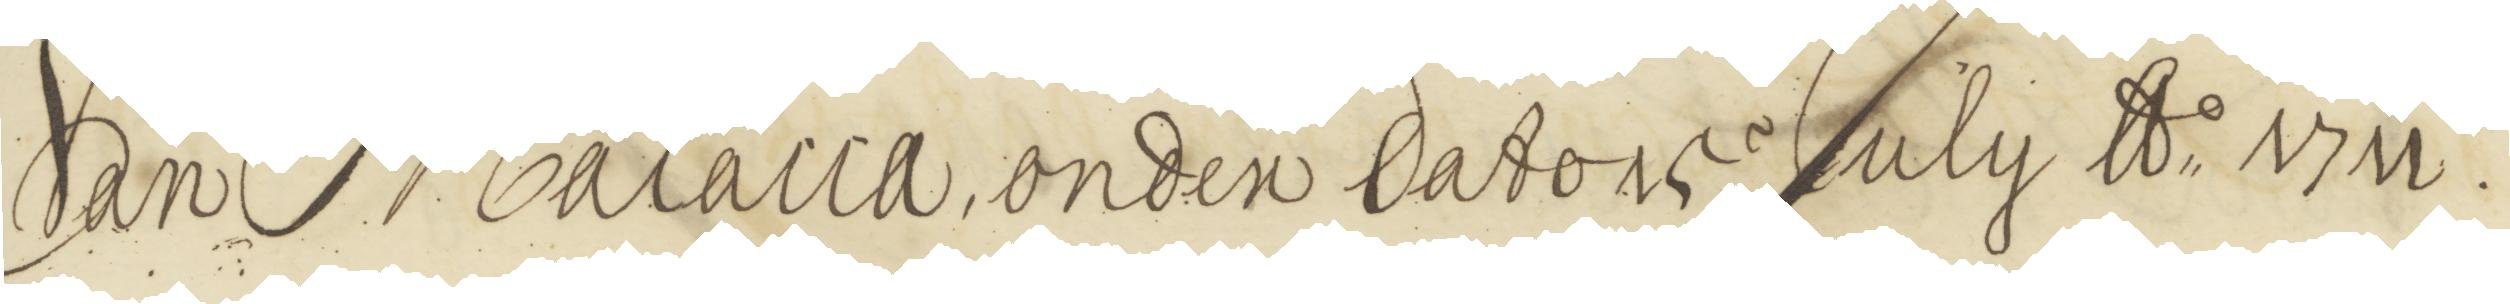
Van Malacca, onder dato 15.e Julij A„o 1711.
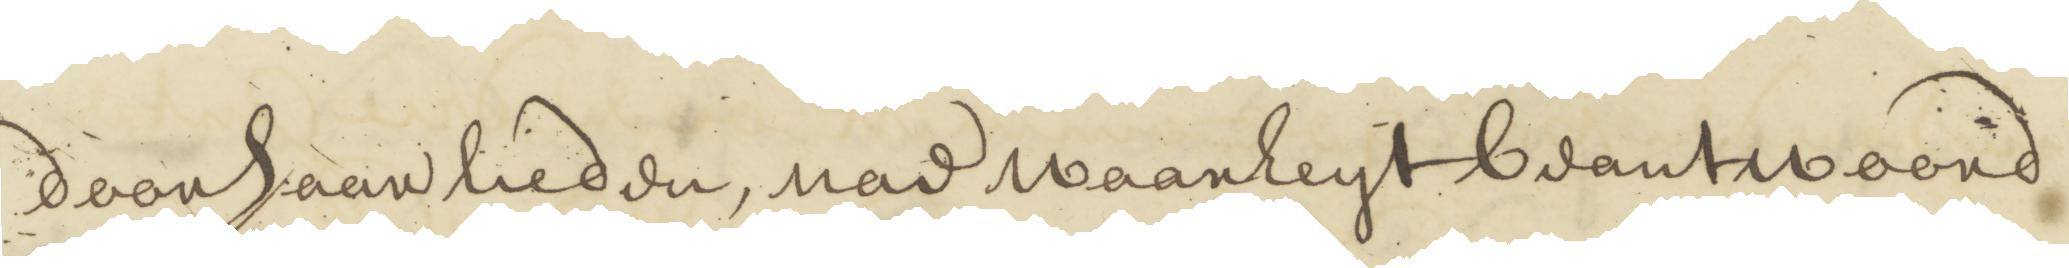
door haar lieden, nae waarheijt beantwoord
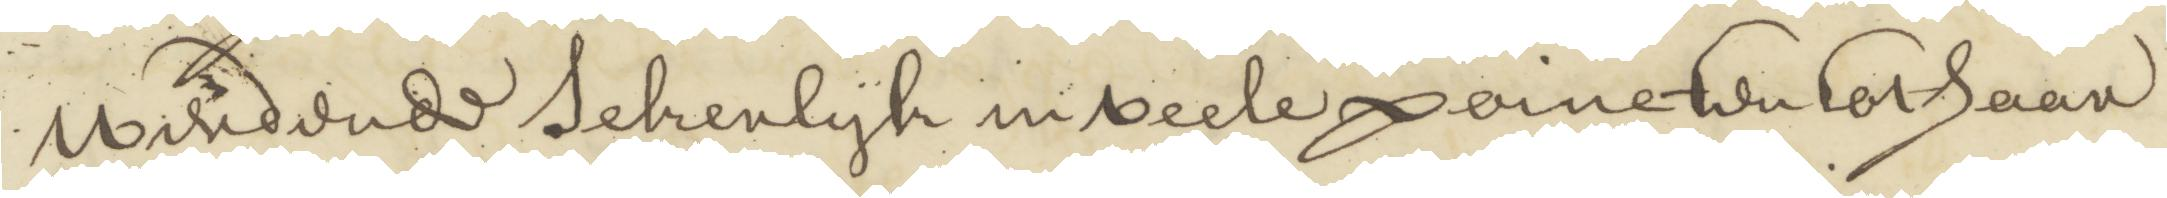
werdende sekerlijk in veele poincten tot haar
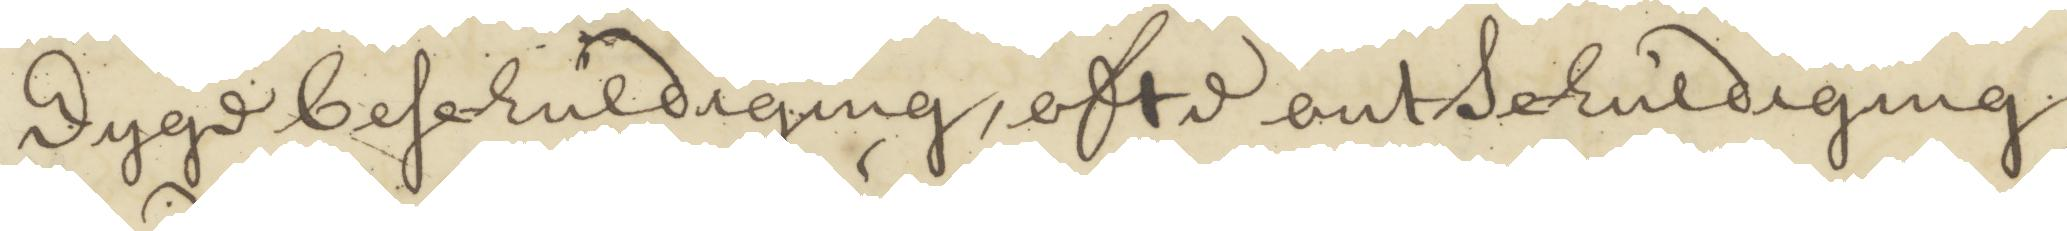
Eijge beschuldiging, ofte ontschuldiging
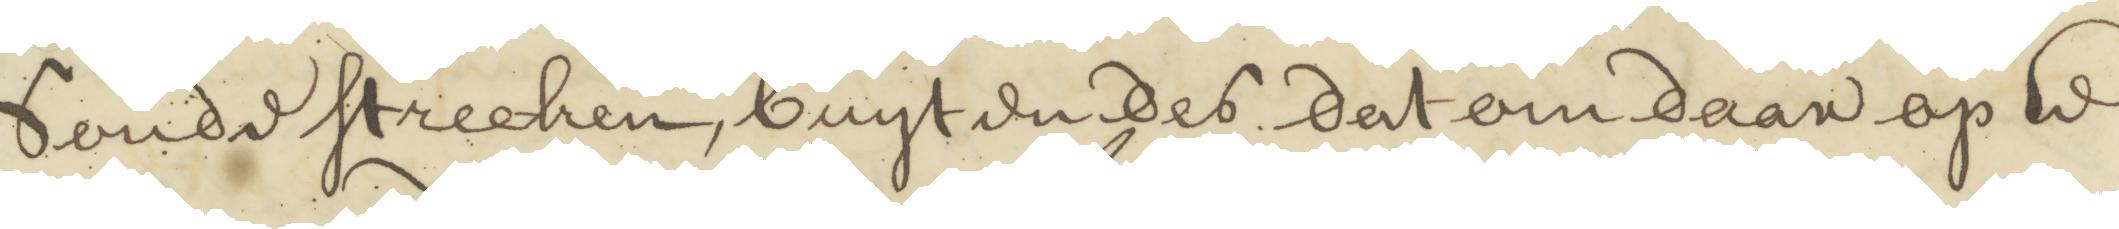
soude strecken, buijten des dat om daar op te
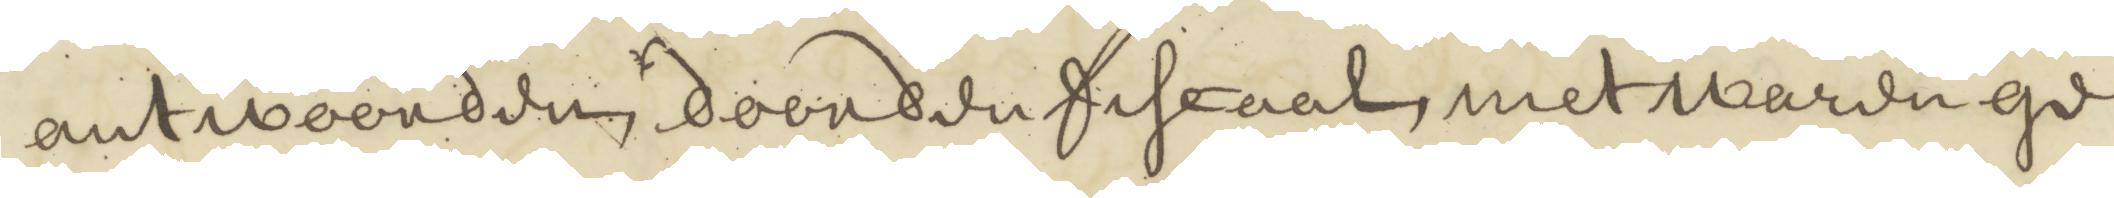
antwoorden, door den fiscaal, niet waren ge
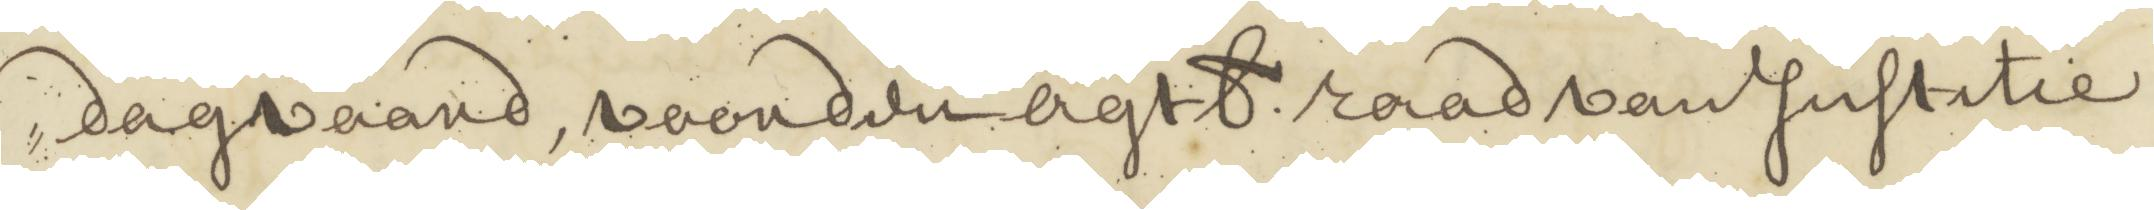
„dagvaard, voor den agtb. raad van Justitie
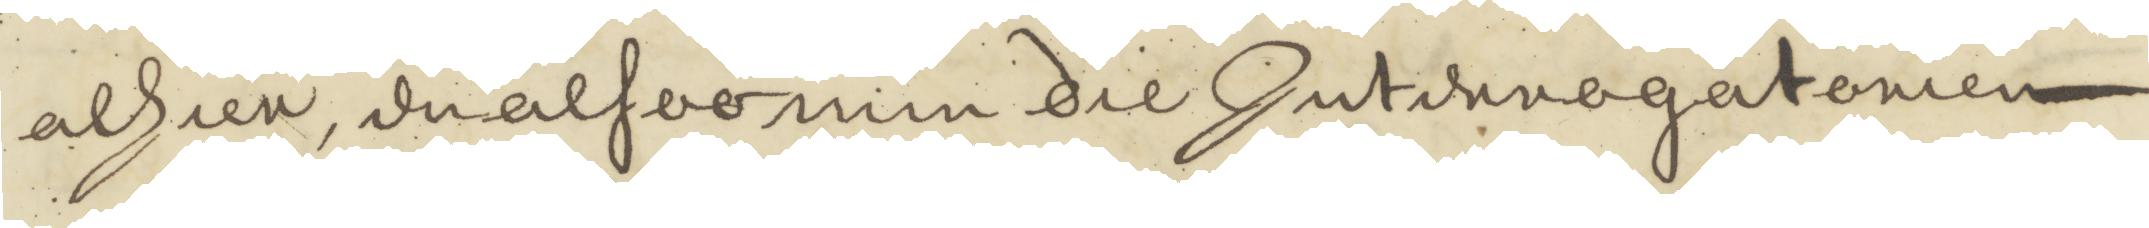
alhier, en alsoo min die Jnterragatorien
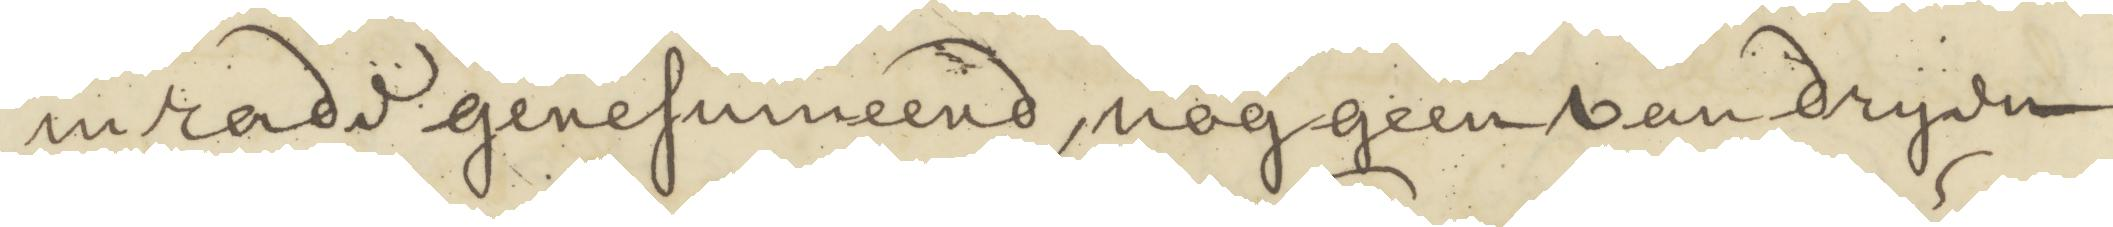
in rade geresumeerd, nog geen van drijen
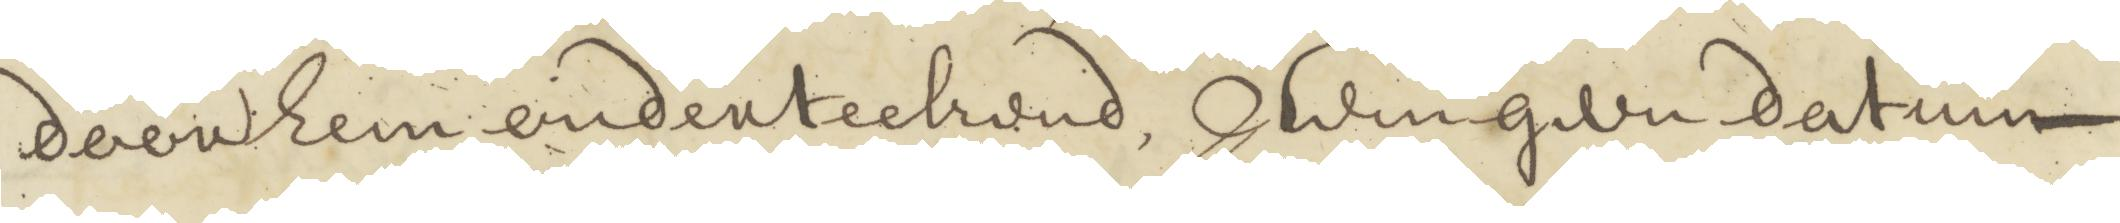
door hem onderteekend, Jtem geen datum
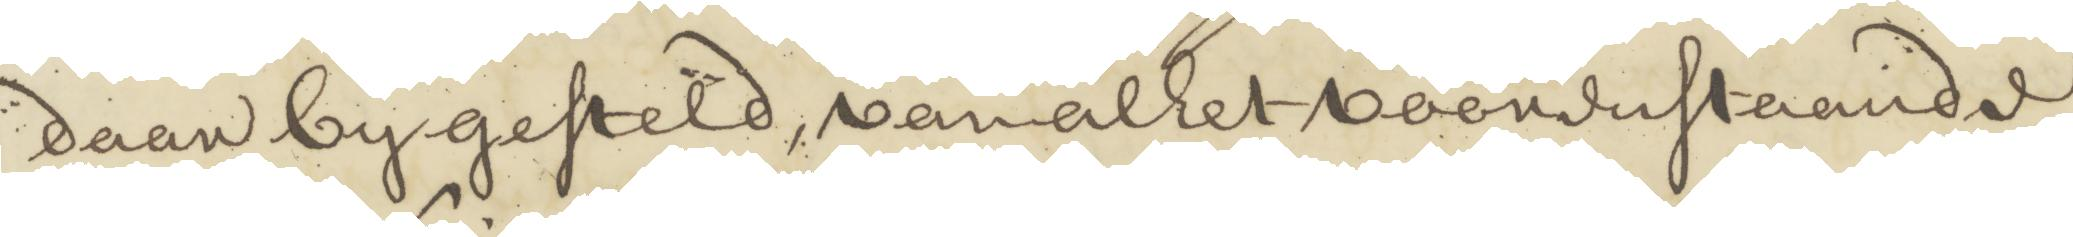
daar bij gesteld, van al het voorenstaande
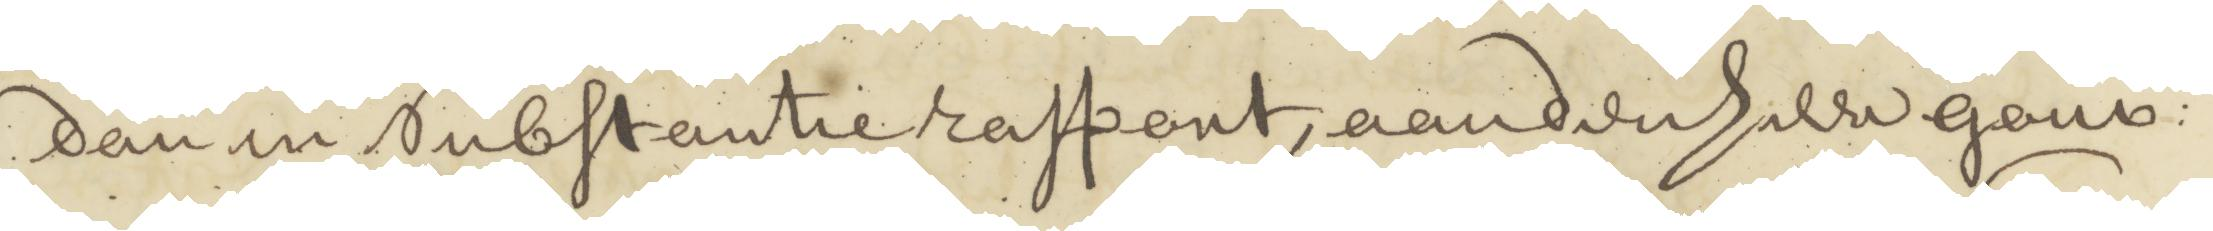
dan in substantie rapport, aan den heer gouv:r
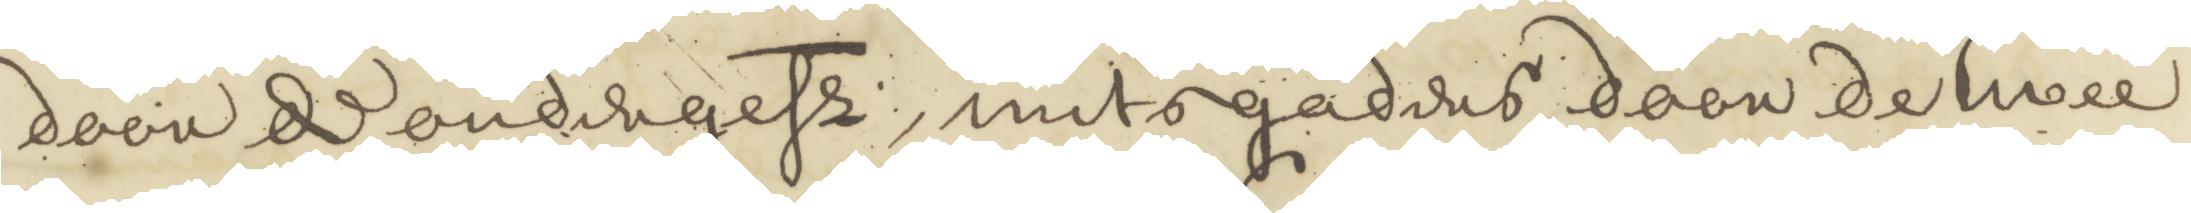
door de onderlesz:, mitsgaders door de twee
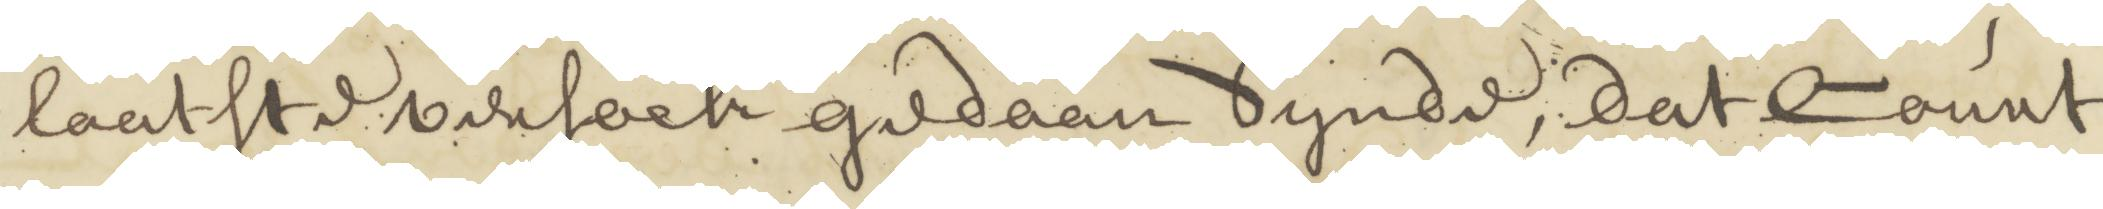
laatste versoek gedaan sijnde, dat Court
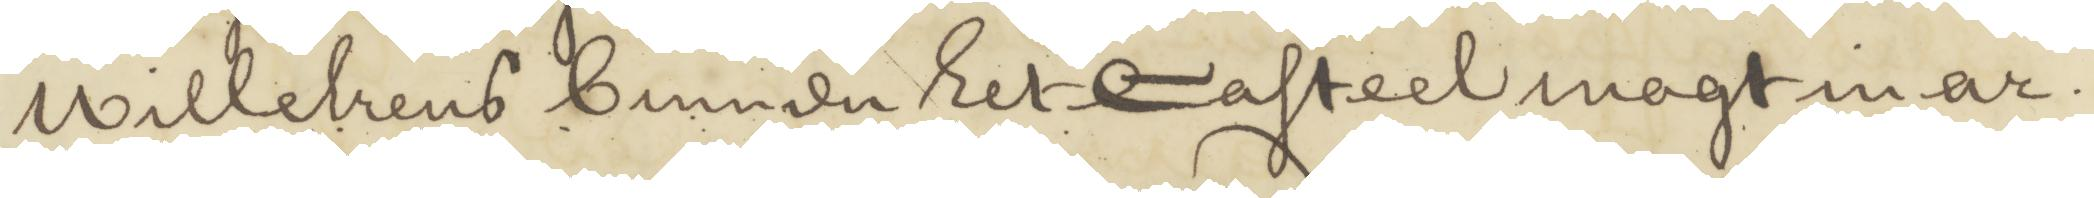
willekens binnen het Casteel mogt in ar
